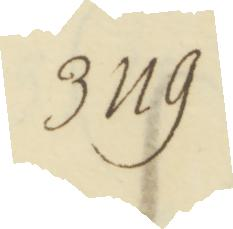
3119
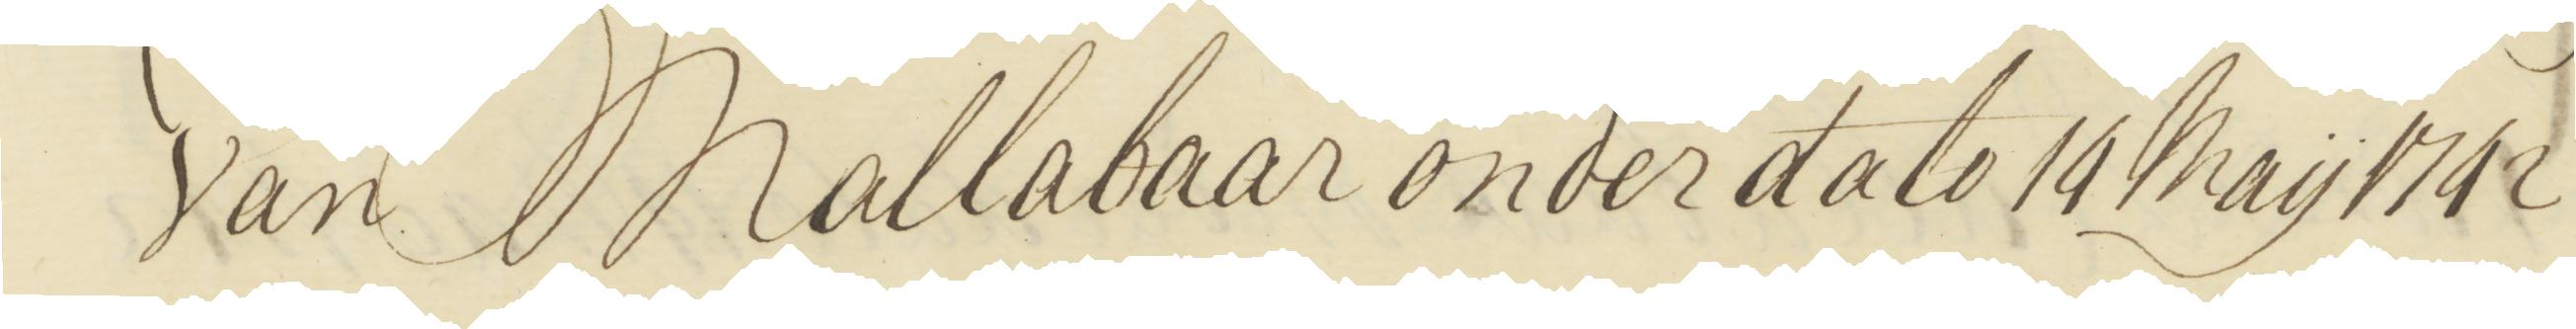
Van Mallabaar onder dato 14 Maij 1742
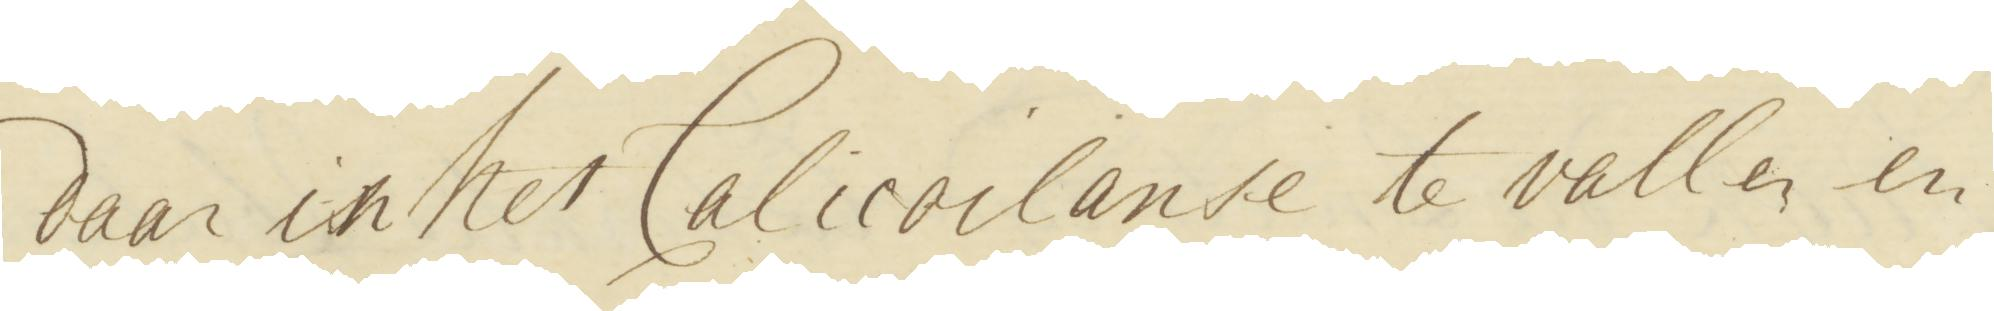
daar in het Calicoilanse te vallen en
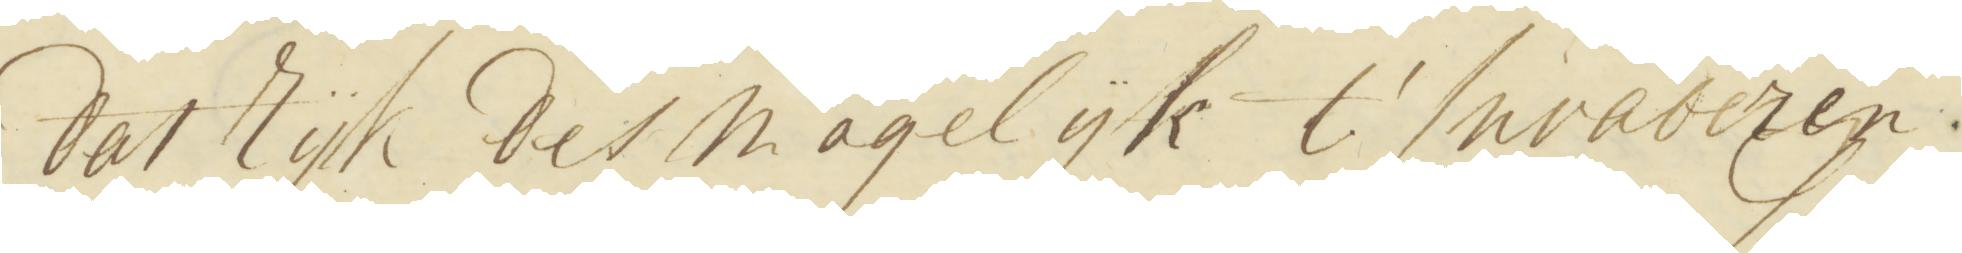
dat rijk des mogelijk t' Jnvaderen.
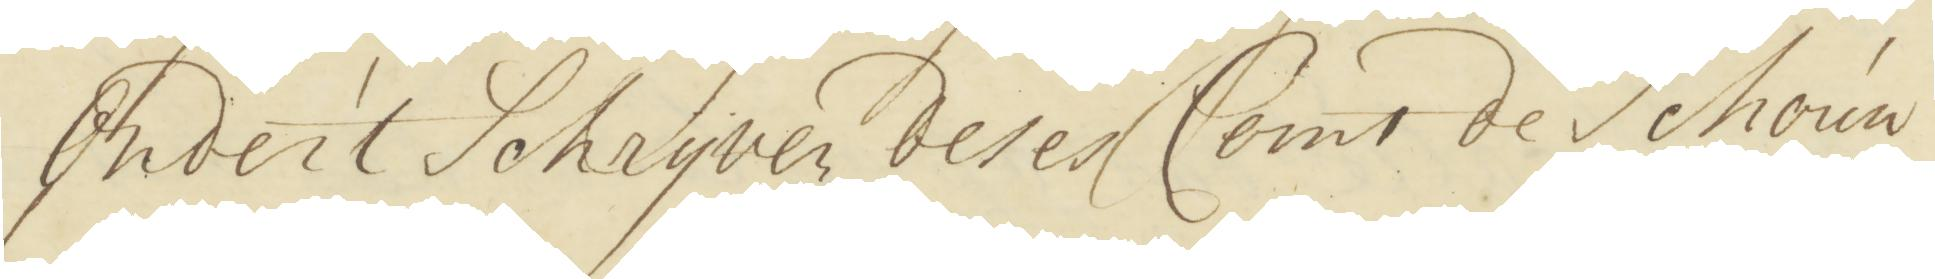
Onder't schrijven deses Comt de Schouw
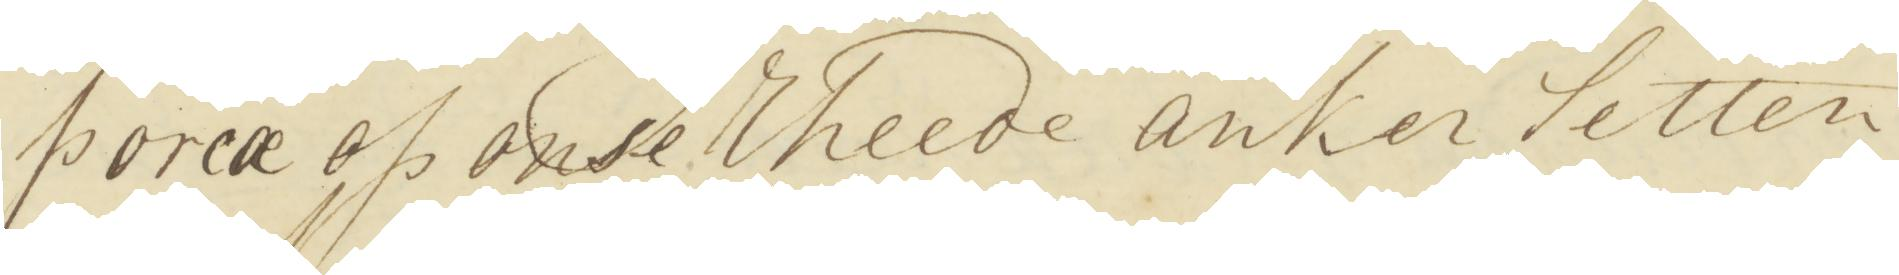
porcae op onse Rheede anker setten
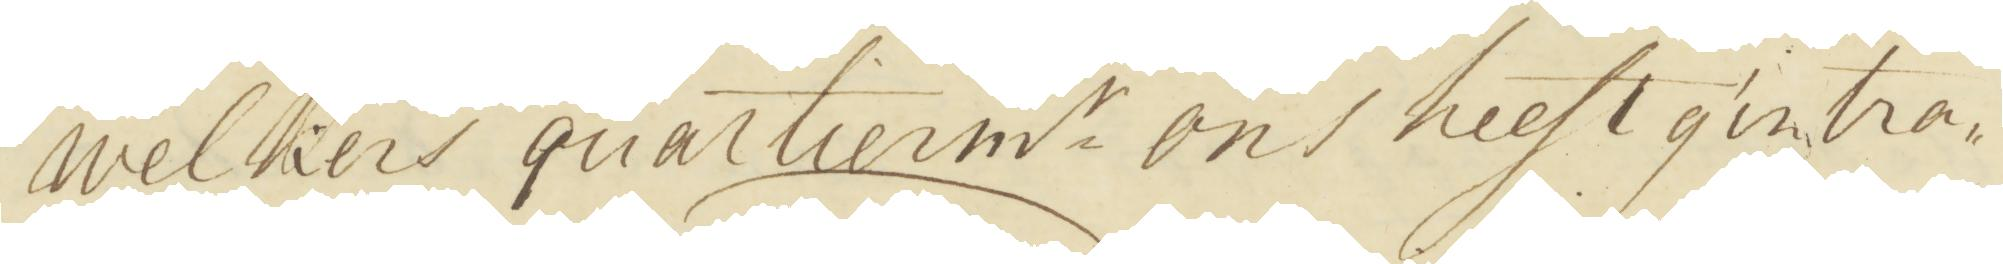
welkers quartierm=r ons heeft g'intra„
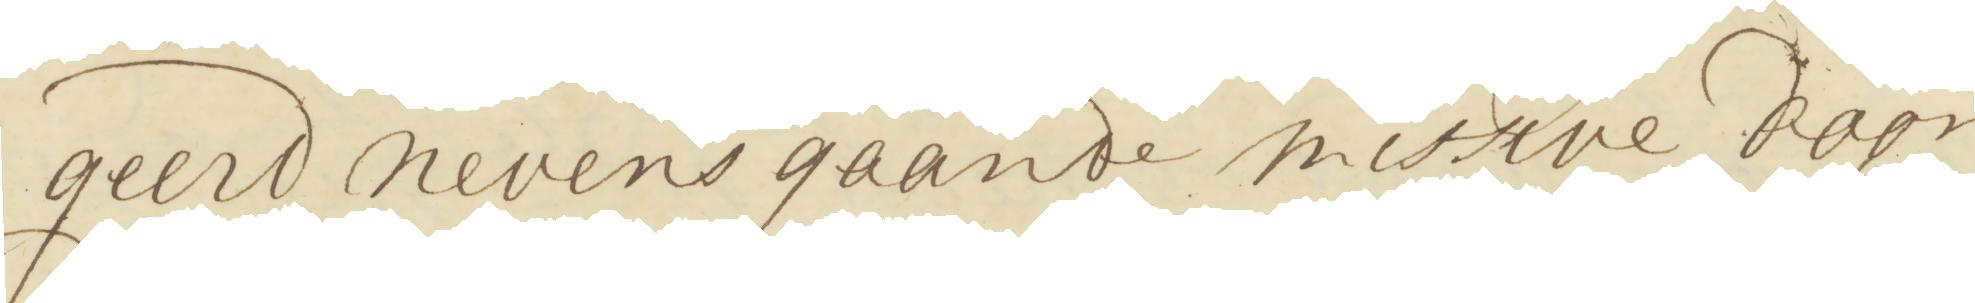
geerd nevens gaande missive door
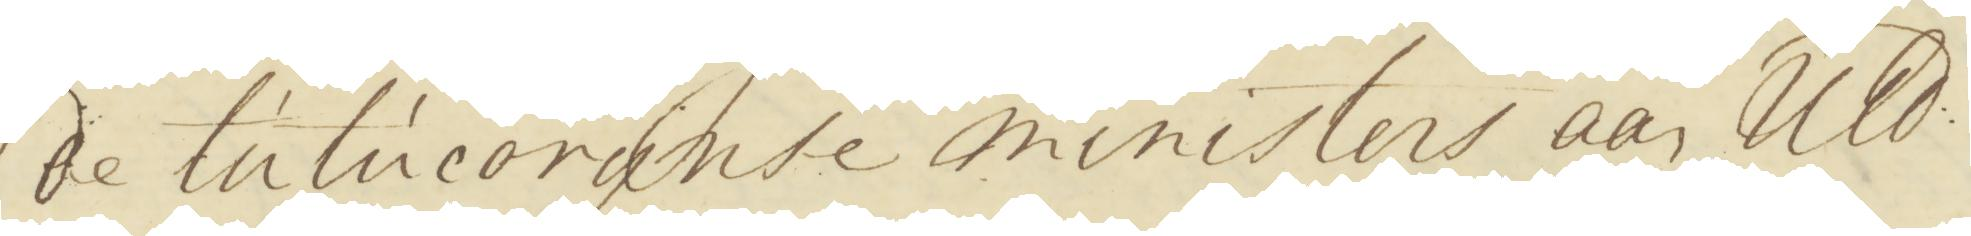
de tutucorijnse ministers aan UEd:
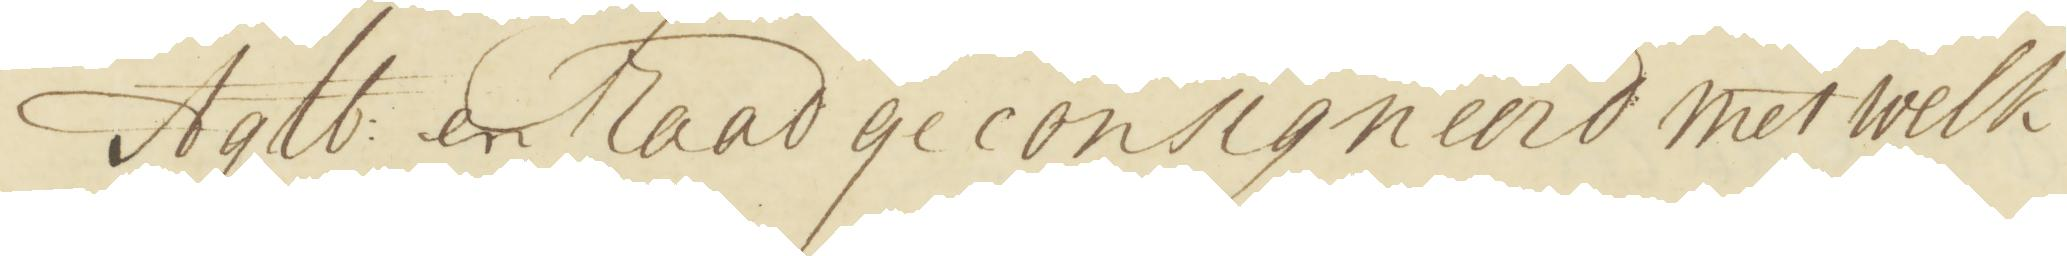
Agtb: en Raad geconsigneerd met welk
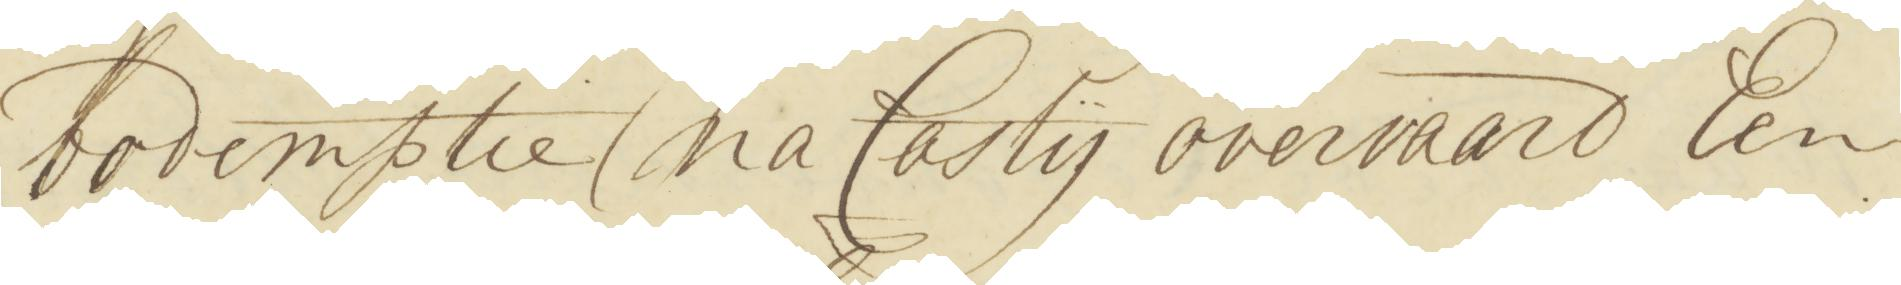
bodemptie (na Costij overvaard Een
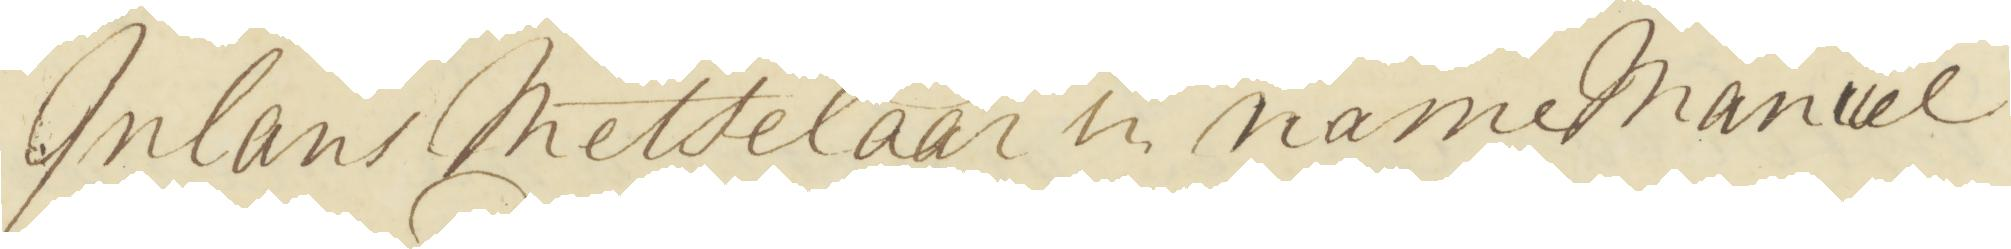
Jnlans Metselaar in name Manuel
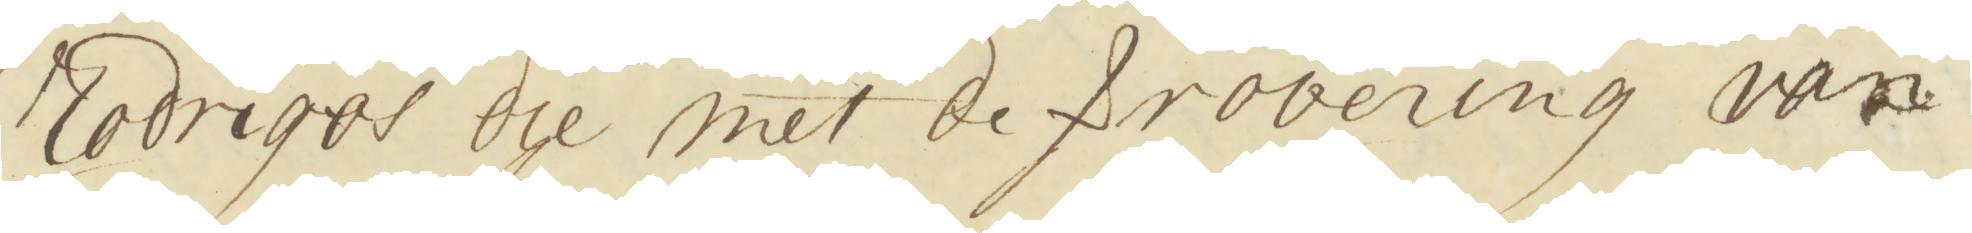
Rodrigos die met de verrovering van
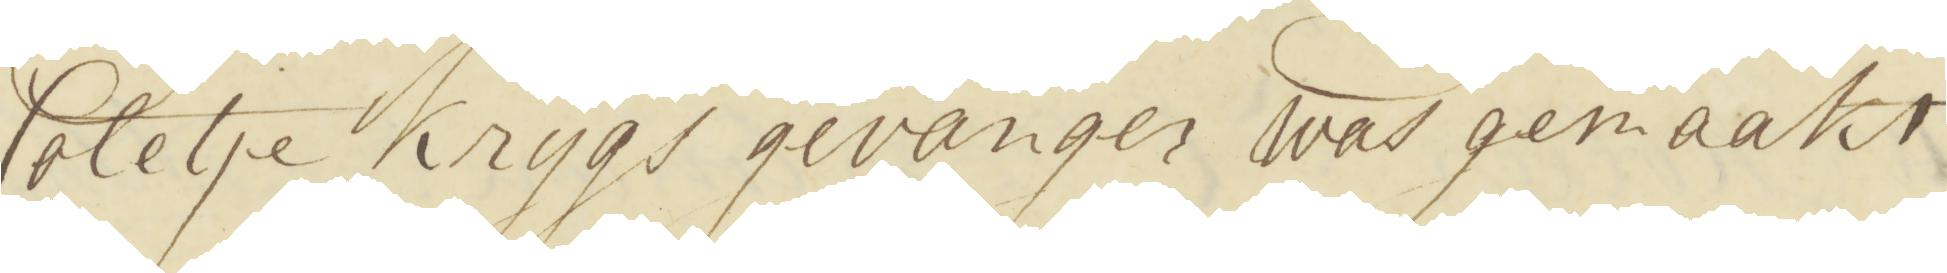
Coletje krijgs gevangen was gemaakt
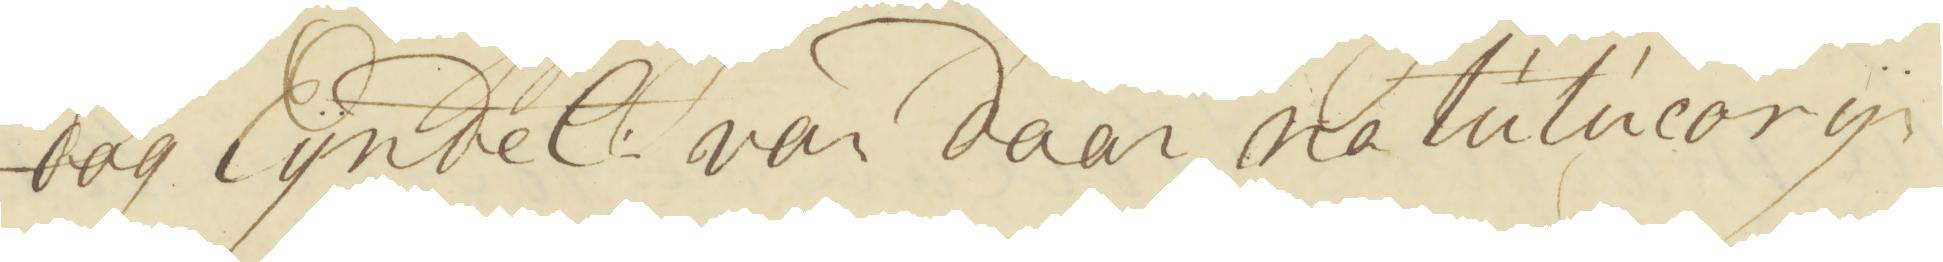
dog Eijndel: van daar na tutucorijn
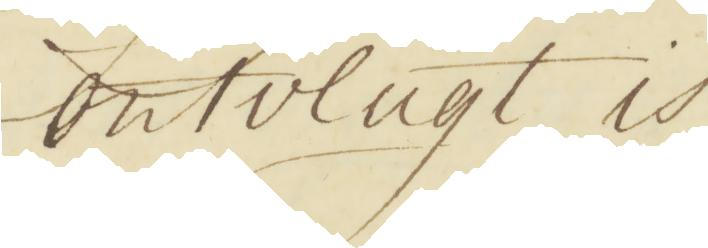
ontvlugt is
